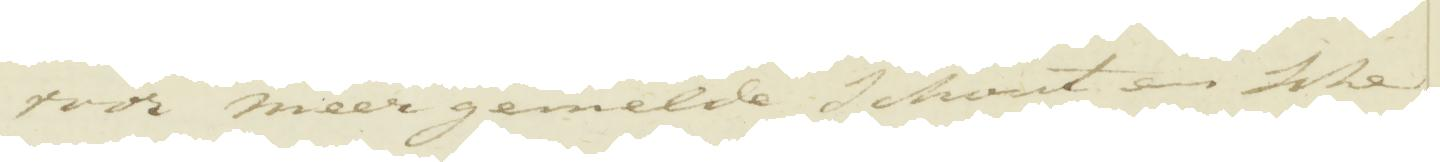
voor meer gemelde schout en sche
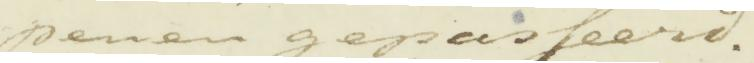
penen gepasseerd.
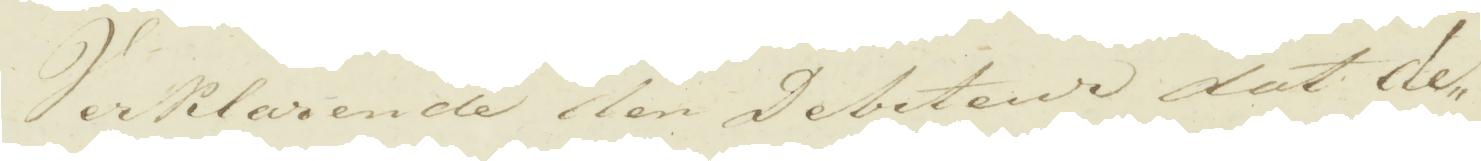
Verklarende den Debiteur dat de„
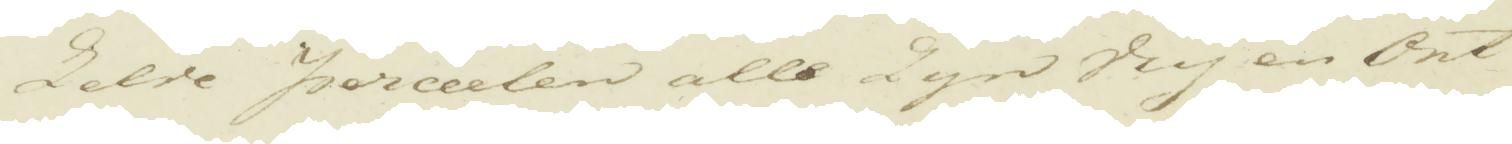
zelve Perceelen alle zyn vry en ont
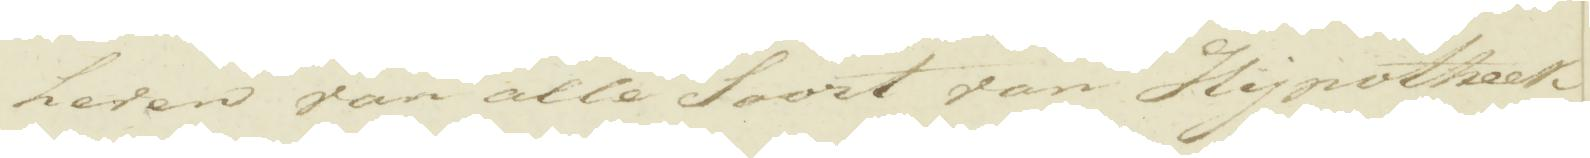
heven van alle Soort van Hijpotheek
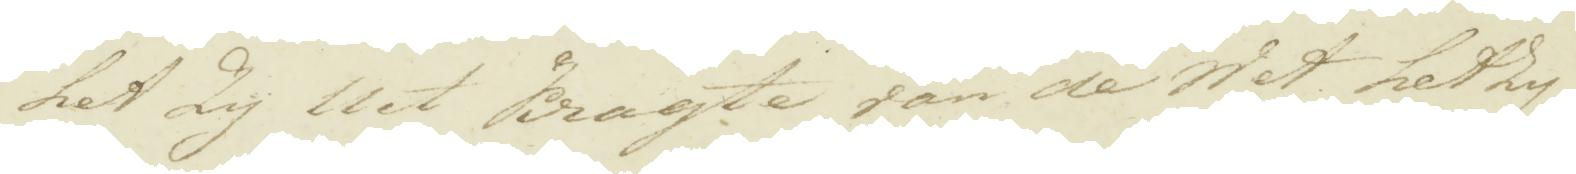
het zij uit kragte van de Wet hetzy
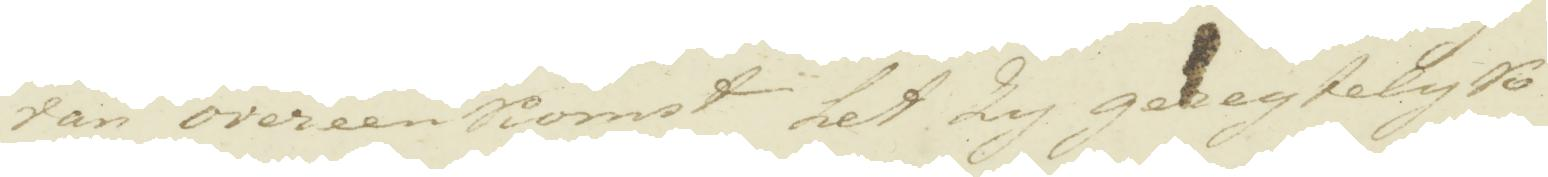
van overeenkomst het zy geregtelyk
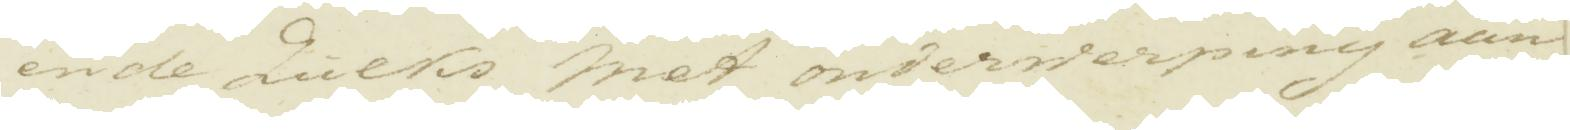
en de zulks met onderwerping aan
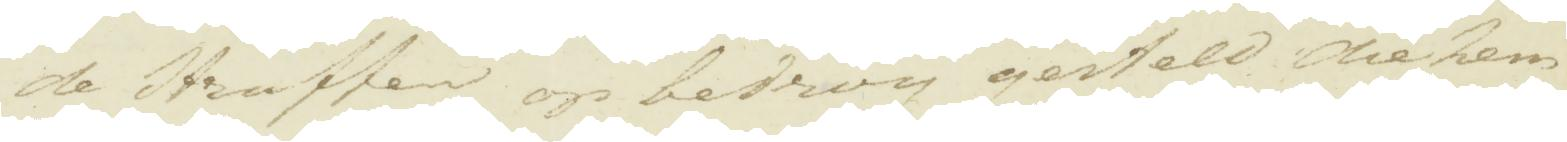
de straffen op bedrog gesteld die hem
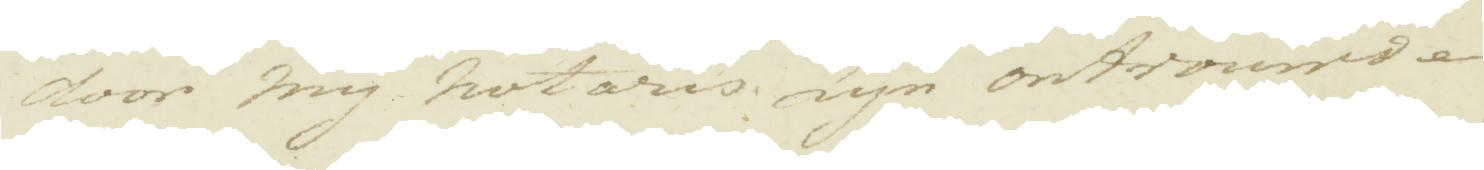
voor my notaris zyn ontvouwd en
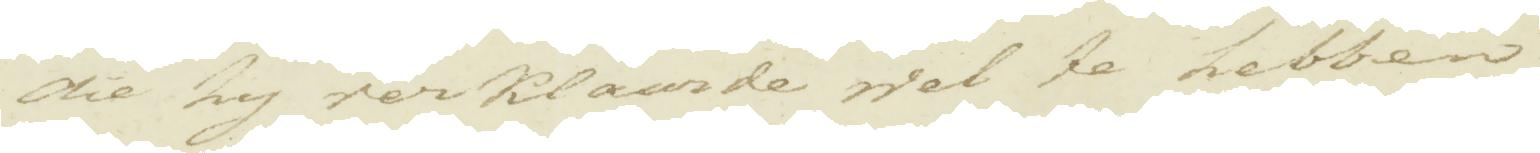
die hy verklaarde wel te hebben
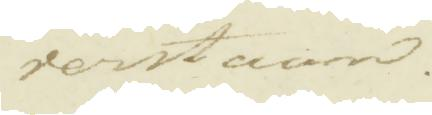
verstaan
